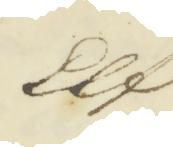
Elf
